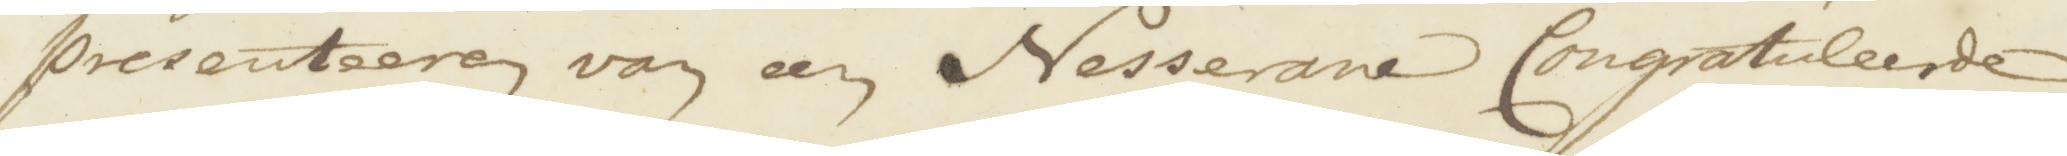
presenteeren van een Nesserane Congratuleerde,
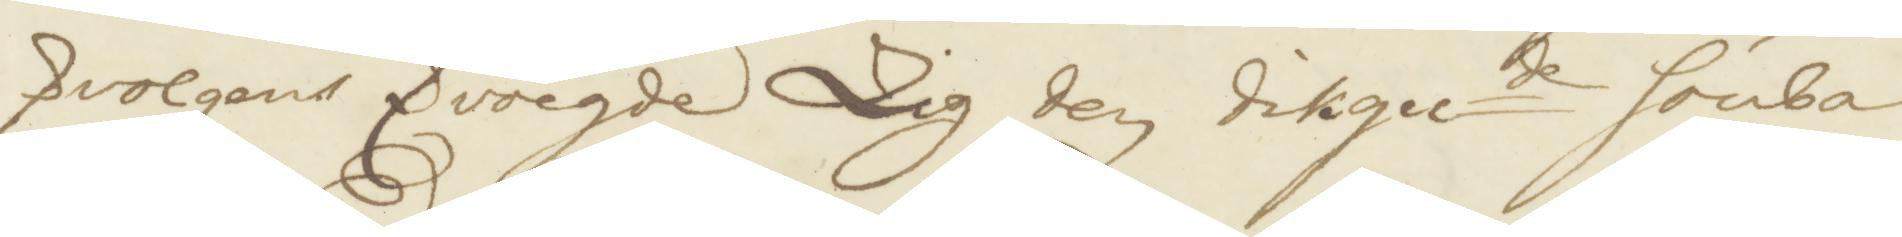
vervolgens vervoegde zig den dikgn=de souba
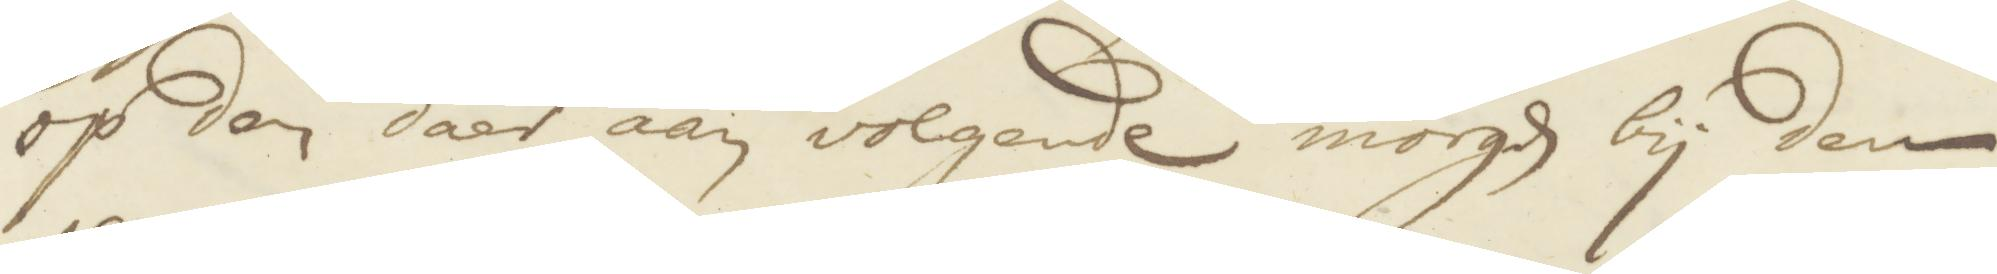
op den daar aan volgende morgen bij den
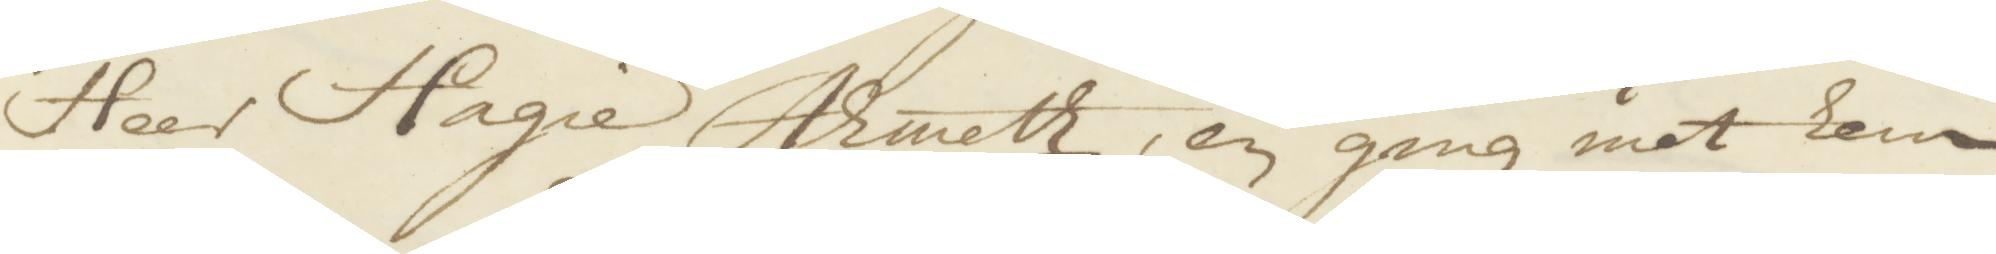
Heer Hagie Ahmeth, en ging met hem
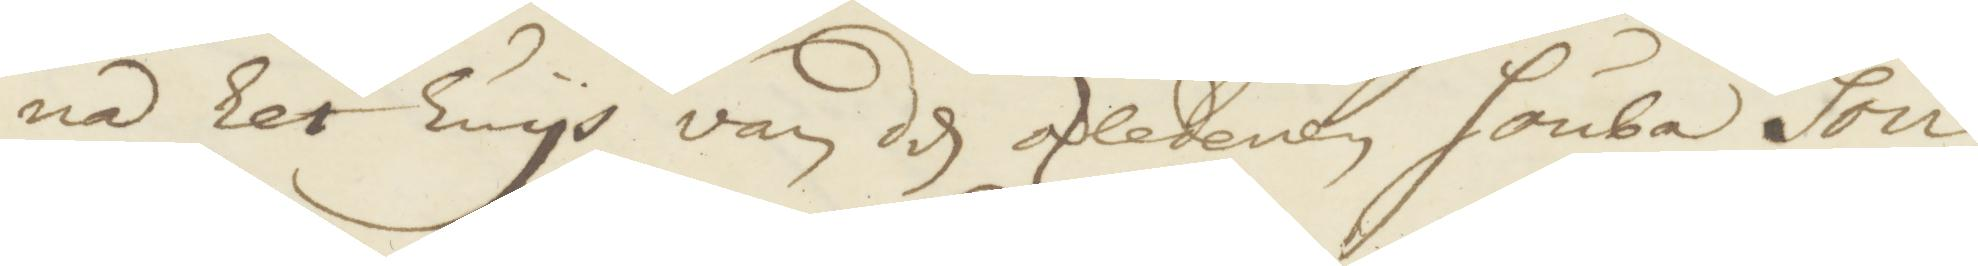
na het huijs van den overledenen souba sou
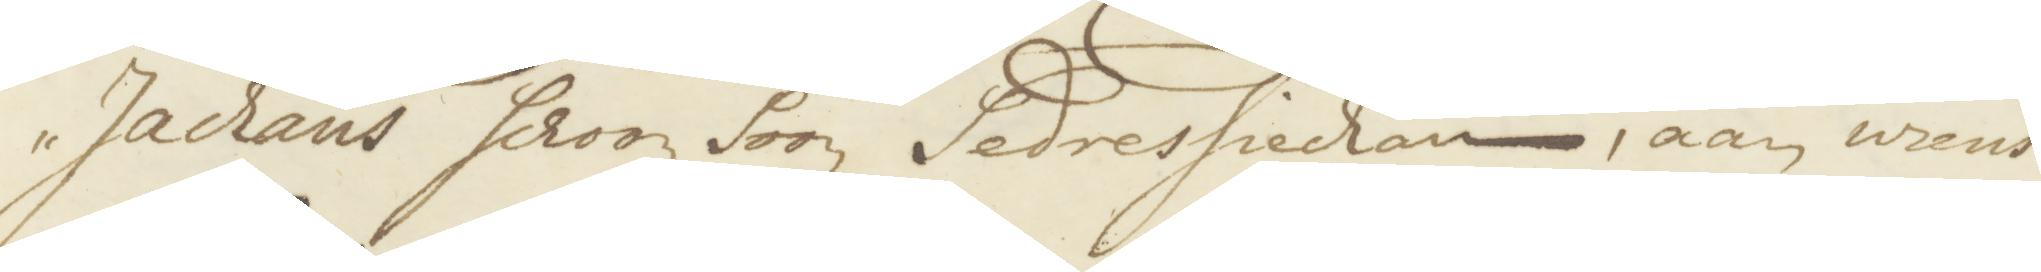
„Jachans schoon soon sedressiechan, aan wiens
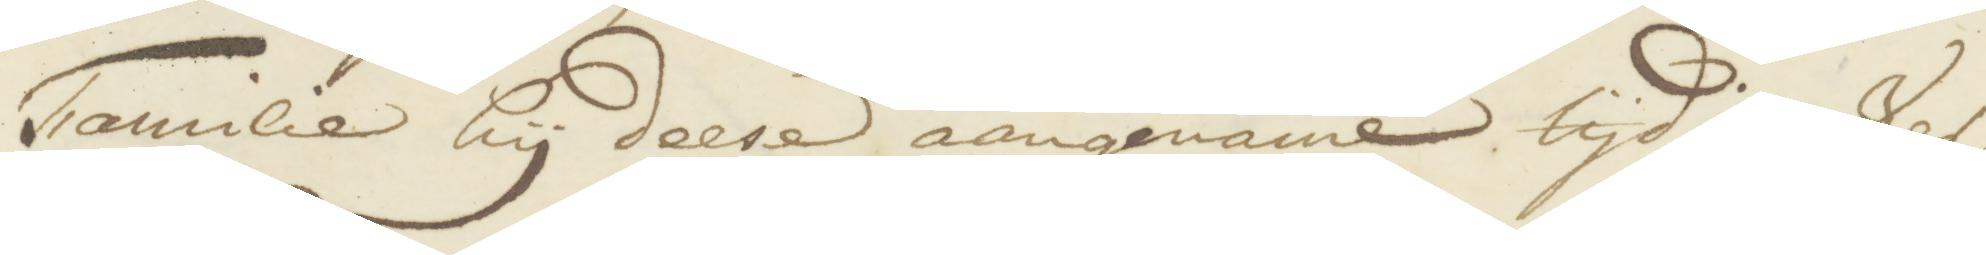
Familie bij deese aangename tijding ver
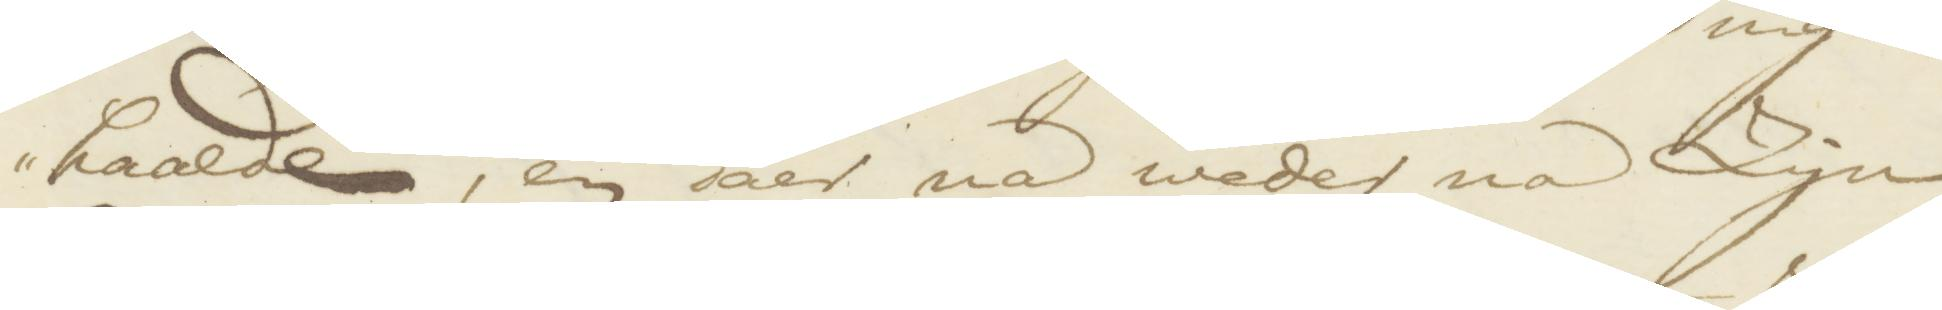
„haalde, en daer na weder na zijn
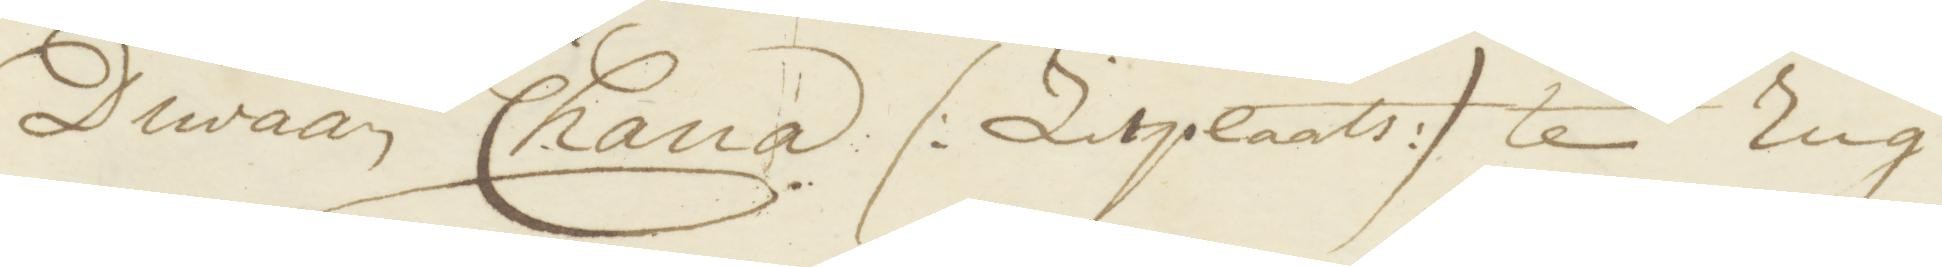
Diwaan Chana: (:zitplaats:) te rug
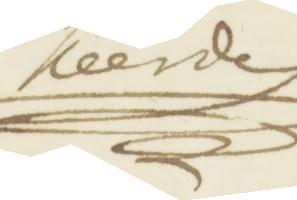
keerden
